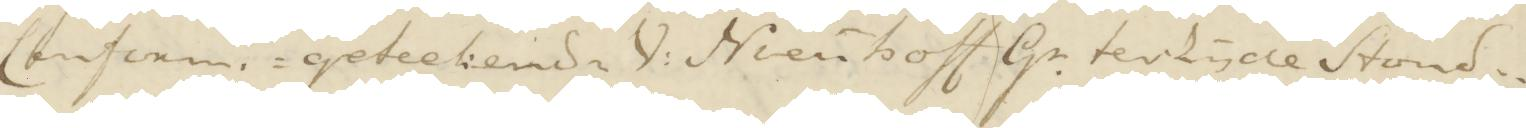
Conform, =geteekend= V: Nieuhoff Gr. terzijde stond..
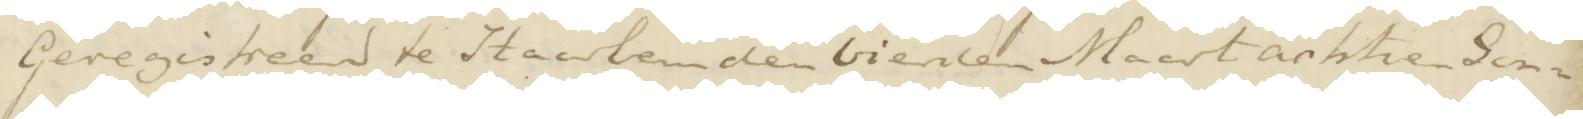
Geregistreerd te Haarlem den vierden Maart achtien Hon=
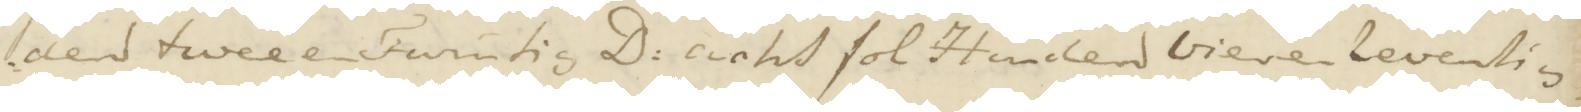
derd twee en Twintig D: acht fol Honderd vier en Zeventig
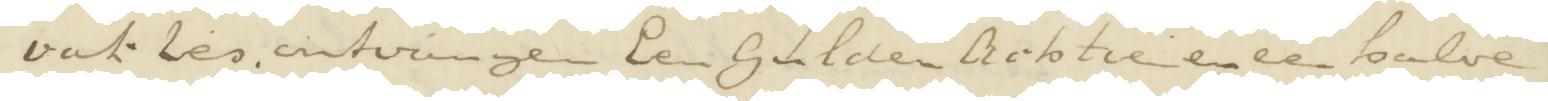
vak Zes, ontvangen Een Gulden Achtien en een halve
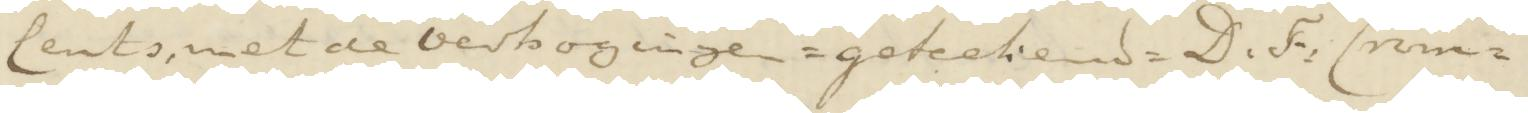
Cents, met de verhogingen =geteekend= D: F: Crom=
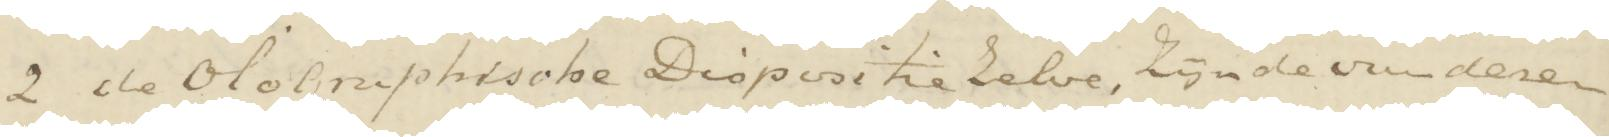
2 de Olographische Dispositie zelve, Zijnde van dezen
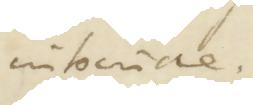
inhoude.
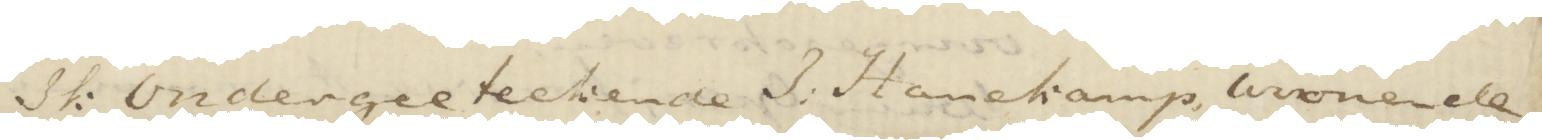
Ik Ondergeeteekende I:Hanekamp, woonende
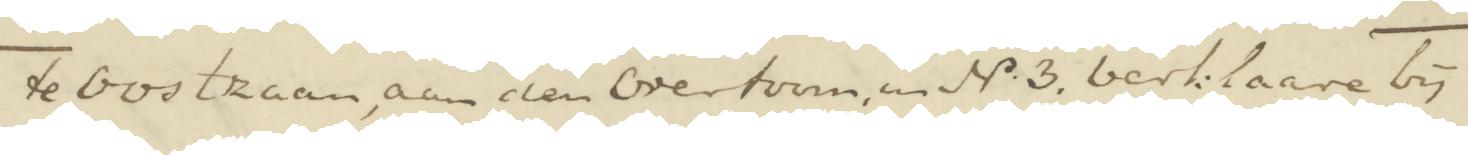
te Oostzaan, aan den Overtoom, in N.3, verklaare bij
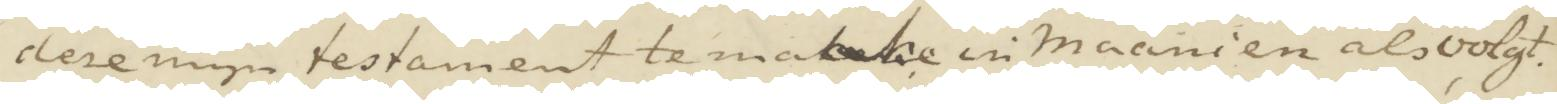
deze myn testament te makke in Maanier als volgt.
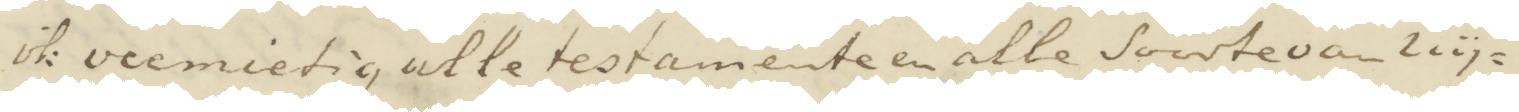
ik vernietig alle testamente en alle soorte van Uij=
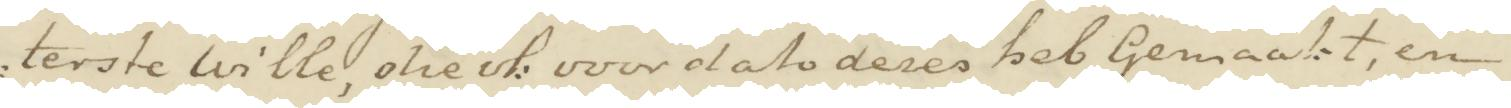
:terste Wille, die ik voor dato dezes heb Gemaakt, en
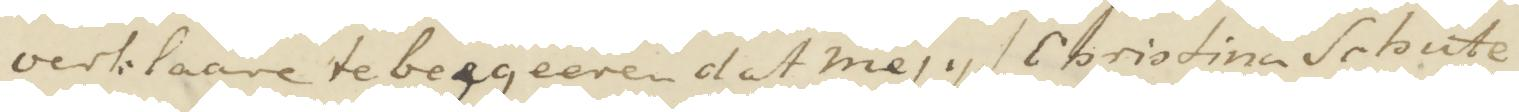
verklaare te beggeeren dat mejuf Christina Schute
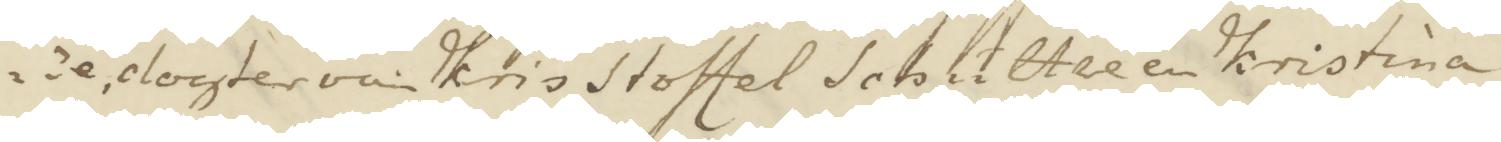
=ze, dogter van Krisstoffel Schultze en Kristina
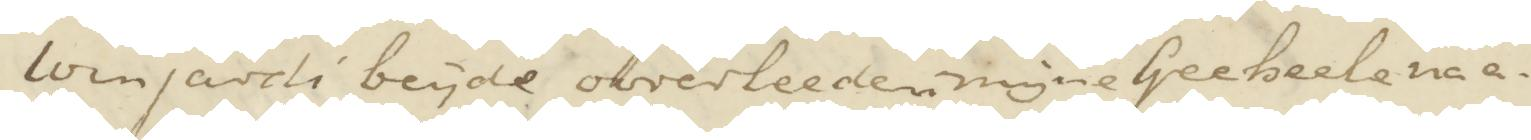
Winjardi beijde ooverleeden mijne Geeheele naa-
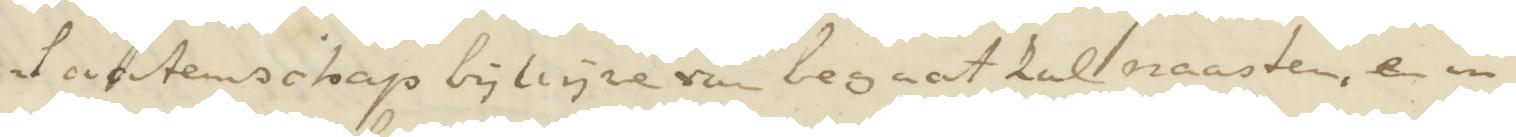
laatenschap bij wijze van legaat zal naasten, en in
